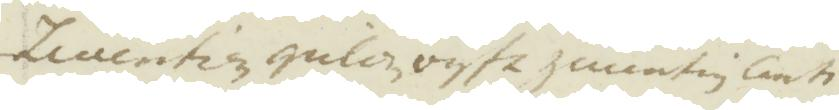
Zeventien gulden vyf en zeventig Cents
